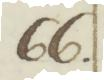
66.
